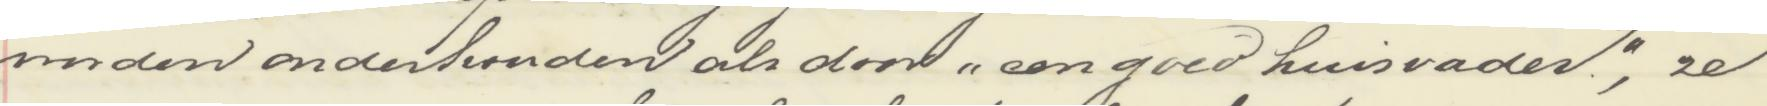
worden onderhouden als door „een goed huisvader", ze
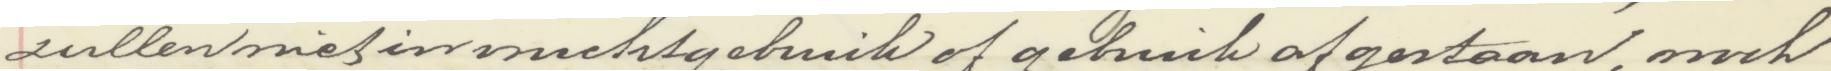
zullen niet in vruchtgebruik of gebruik afgestaan, noch
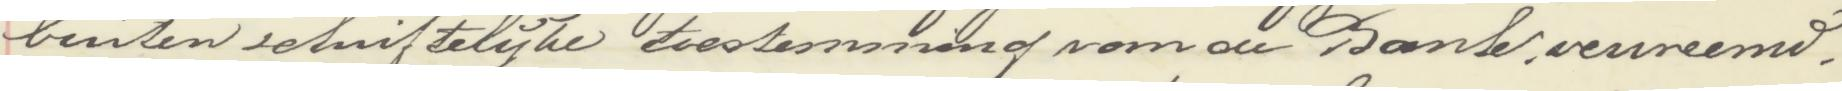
buiten schriftelijke toestemming van de Bank, vervreemd,
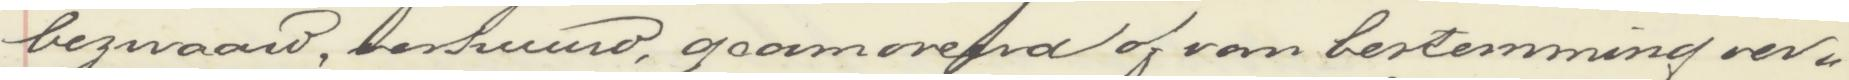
bezwaard, verhuurd, geamoveerd of van bestemming ver„
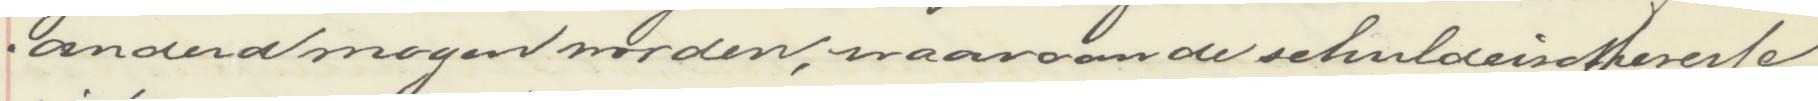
anderd mogen worden, waarvan de schuldeischeresse
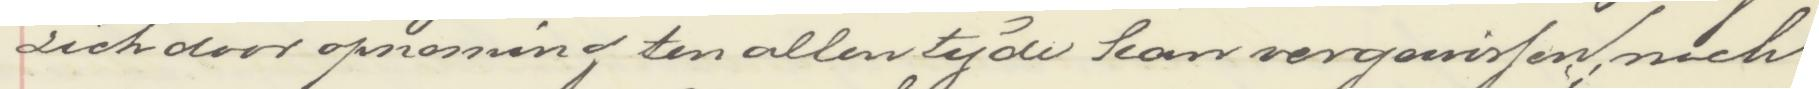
zich door opneming ten allen tjde kan vergewissen, noch
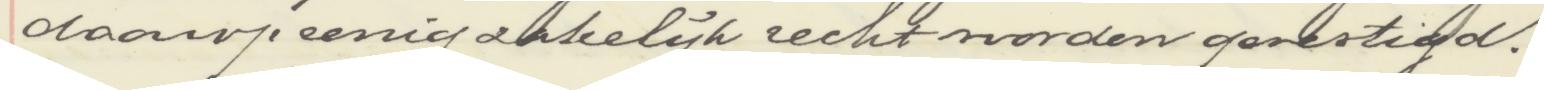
daarop eenig zakelijk recht worden gevestigd.
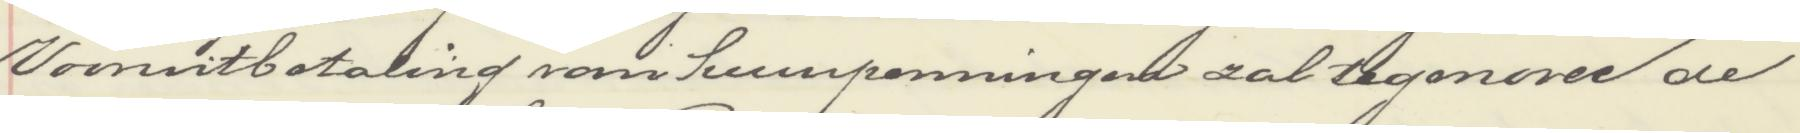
Vooruitbetaling van huurpenningen zal tegenover de
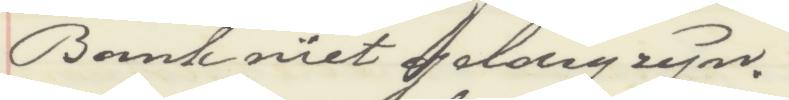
Bank niet geldig zijn.
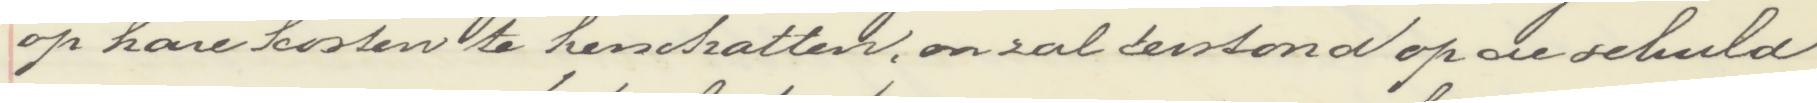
op hare kosten te herschatten, en zal terstond op de schuld
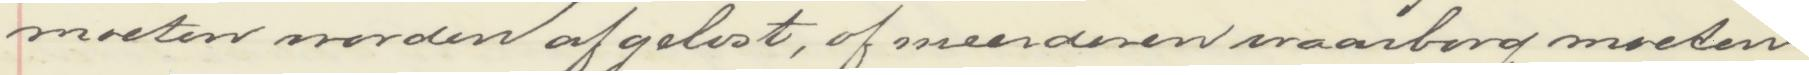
moeten worden afgelost, of meerderen waarborg moeten
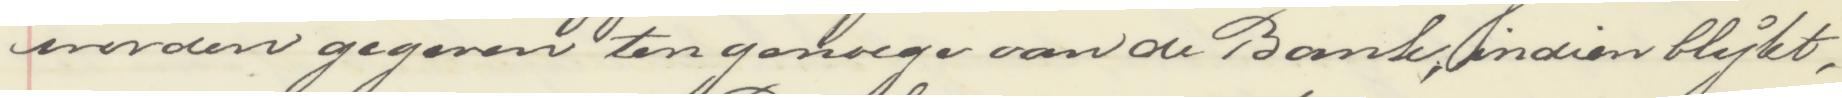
worden gegeven ten genoege van de Bank, indien blijkt,
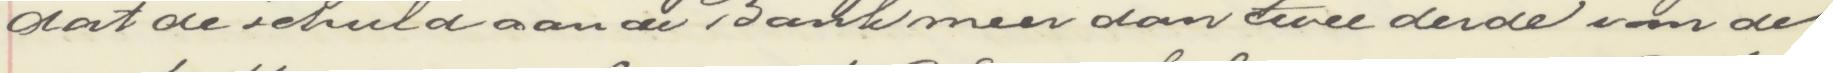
dat de schuld aan de Bank meer dan twee derde van de
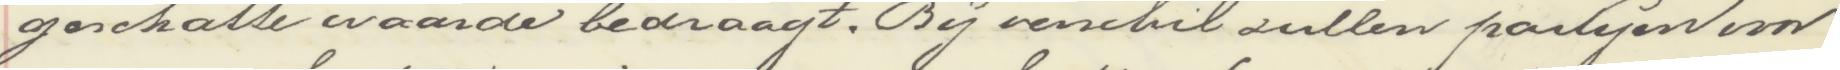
geschatte waarde bedraagt. Bij verschil zullen partyen voor
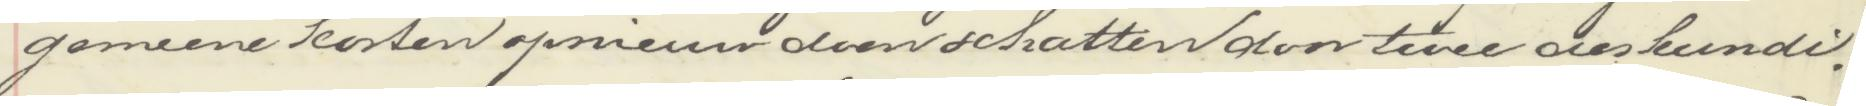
gemeene kosten opnieuw doen schatten door twee deskundi„
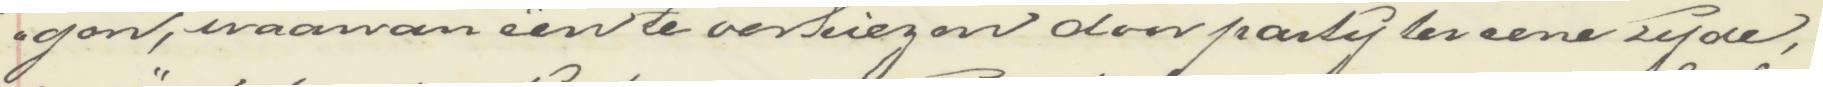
=gen, waarvan één te verkiezen door partij ter eene zijde,
